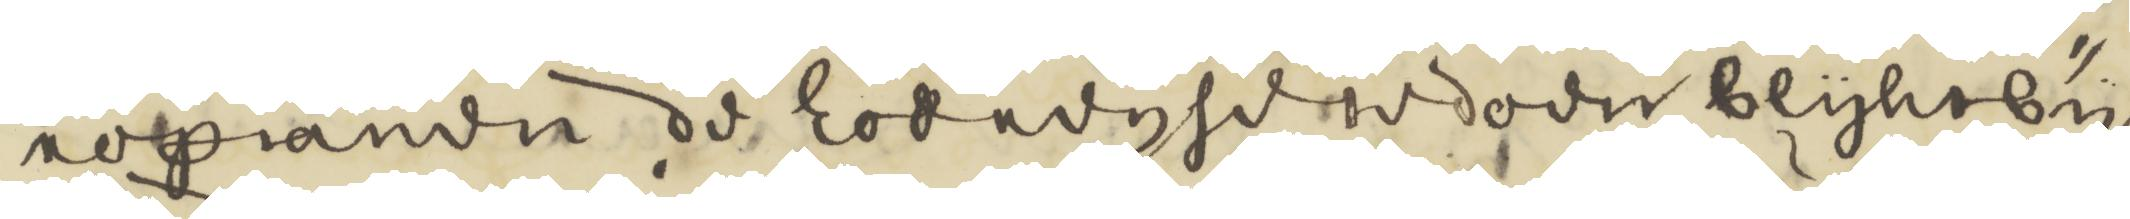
ropianen de hofreijse tedoen blijktbij
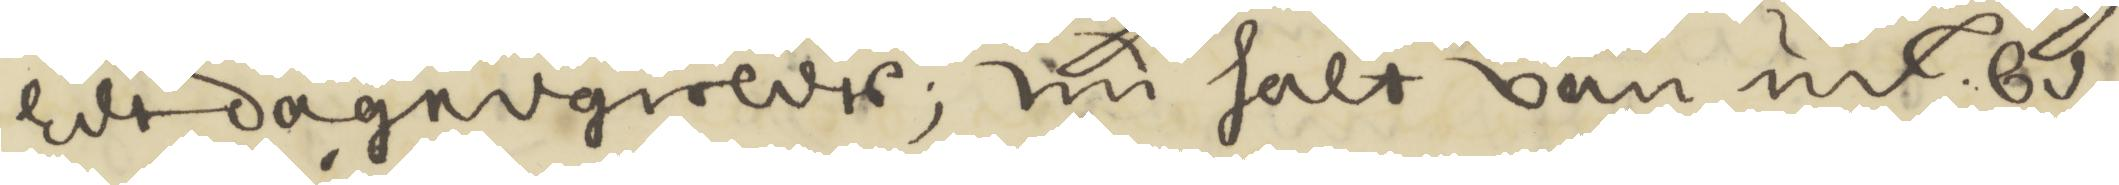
het dagregister; nu salt van uE. be
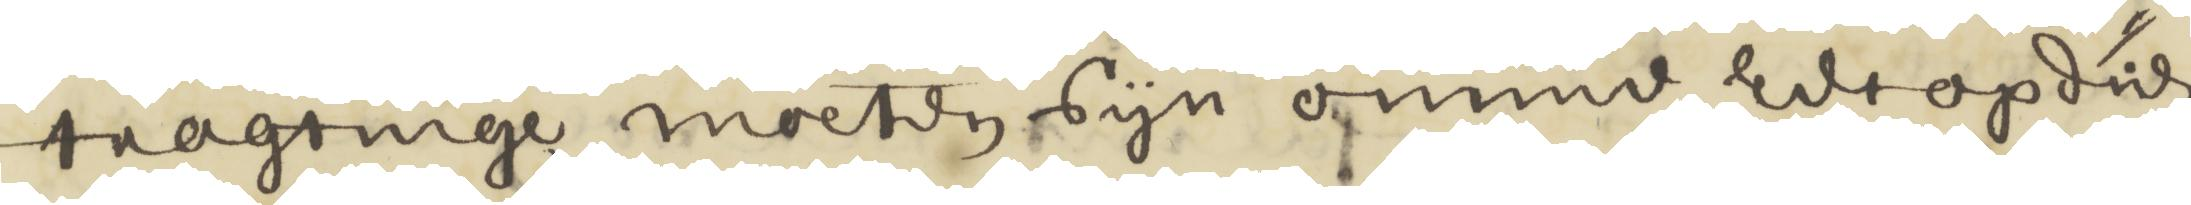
tragtinge moeten sijn omme het op dien
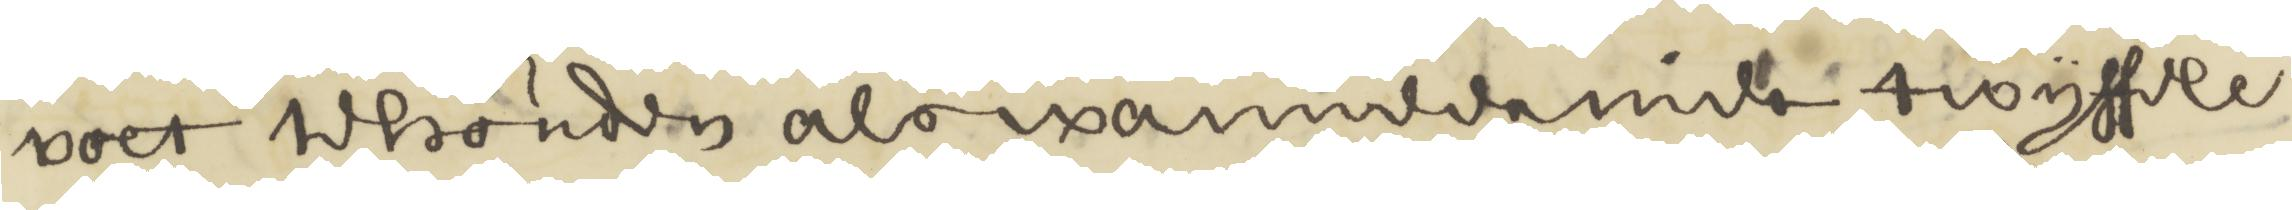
voet tehouden als wanneer niet twijffele
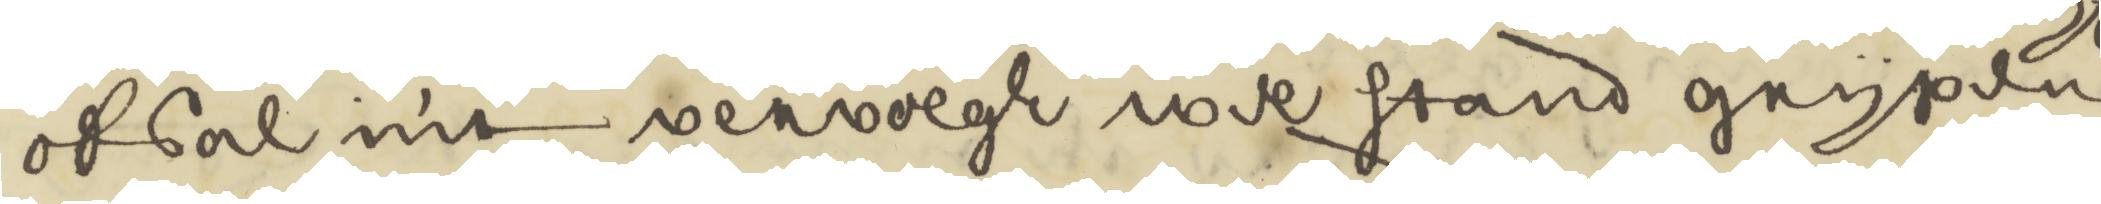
of sal in't vervolgh wel stand grijpen
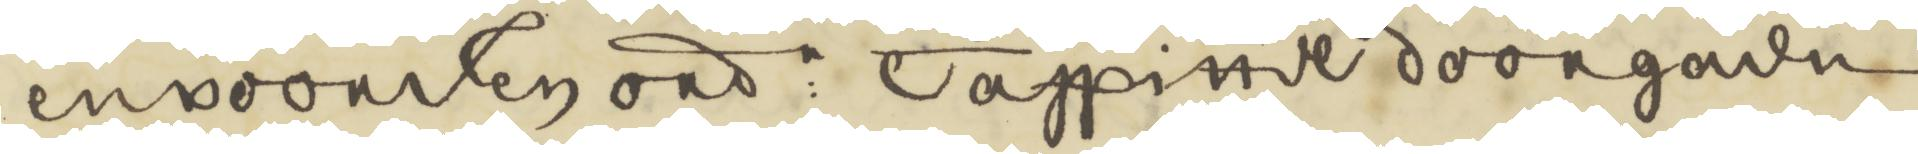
en voor Een ord:r Cappittel doorgaen
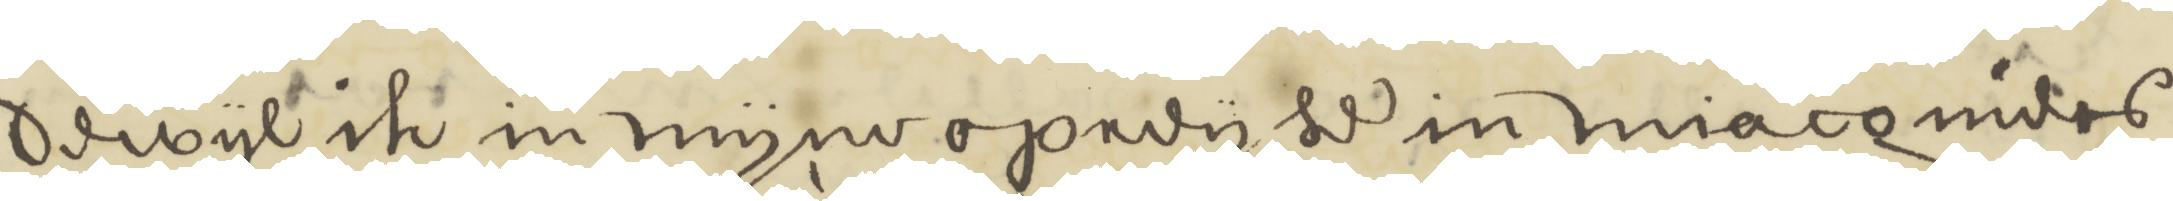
dewijl ik in mijne opreijse in miaco niets
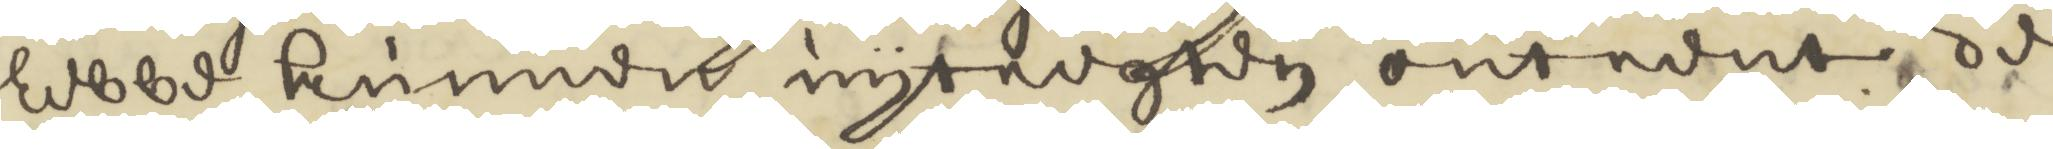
hebbe kunnen uijtregten ontrent de
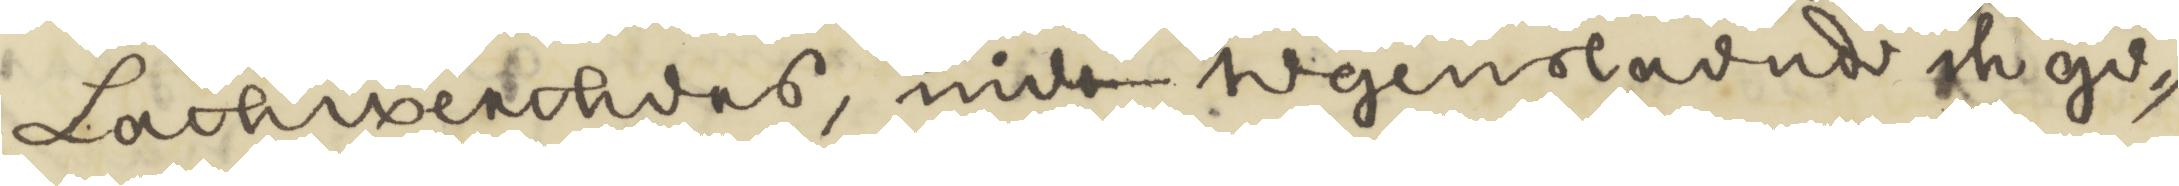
Lackwerckers, niet tegenstaende ik ge„
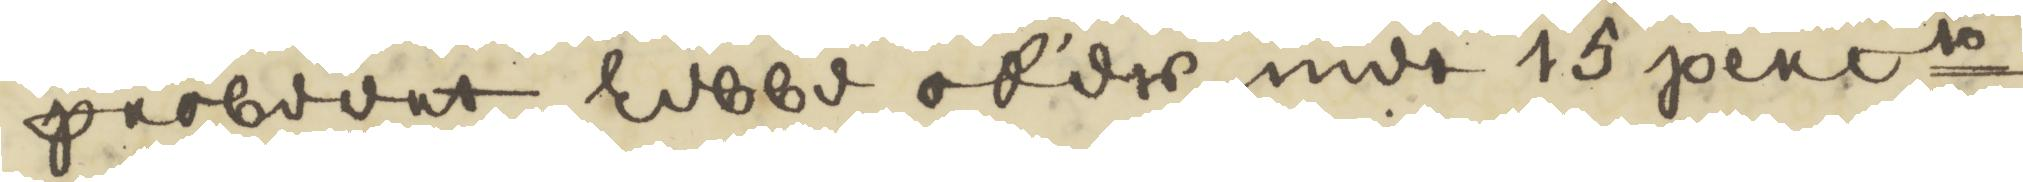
probeert hebbe of'er met 15 perc=to
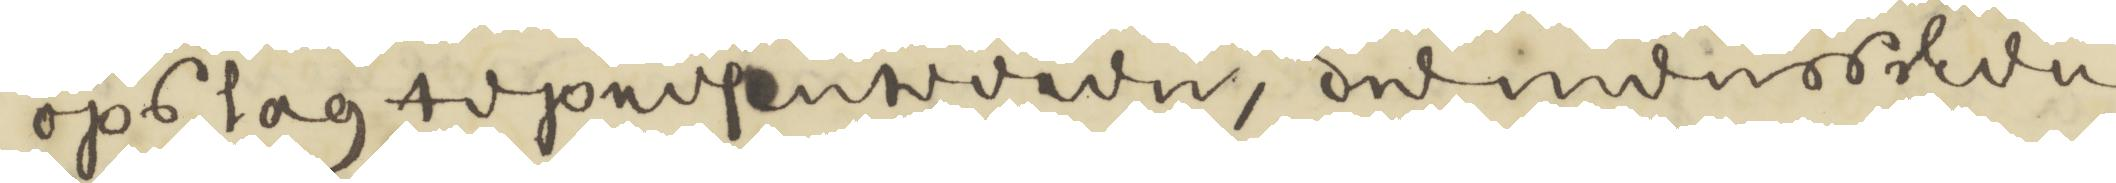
opslag te presenteeren, die mensschen
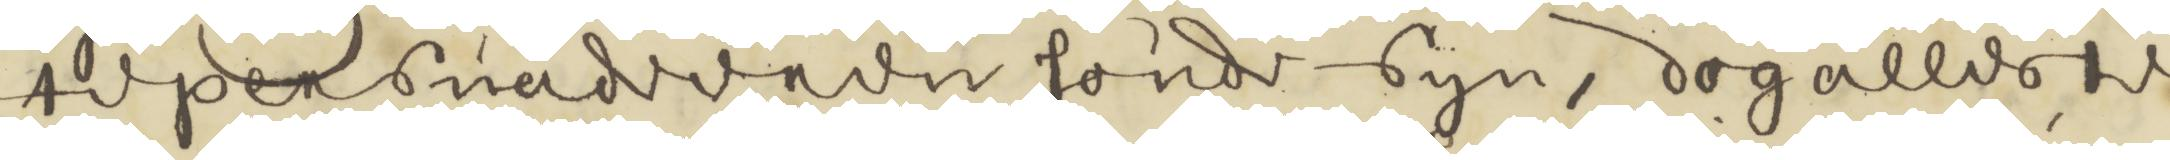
tepersuadeeren soude sijn, dog alles te
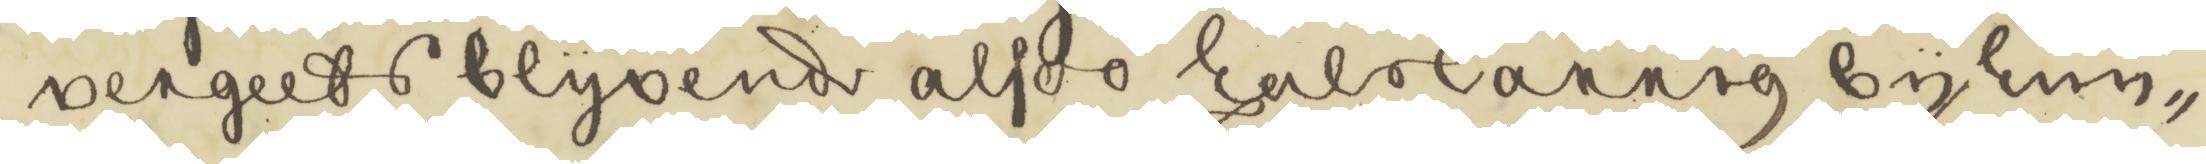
vergeefs blijvende alsoo halstarrig bij hun„
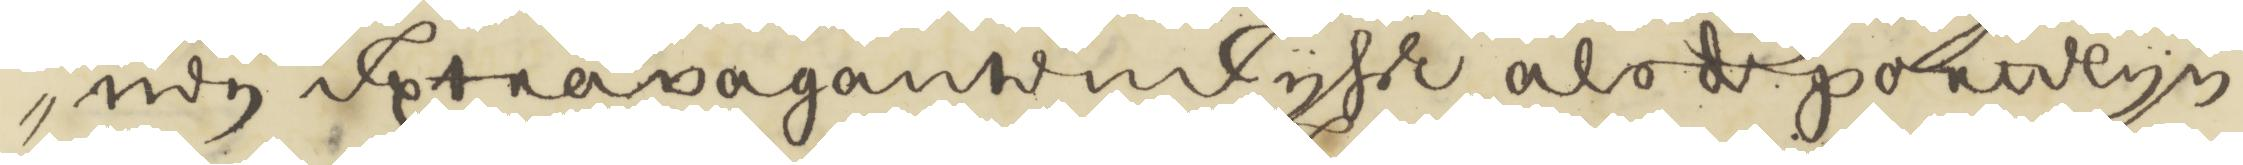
„nen Extravaganten Eijsch als de porcelijn
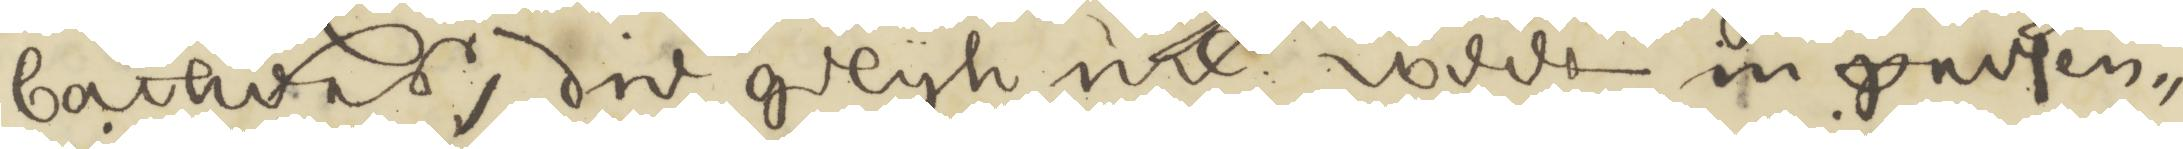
backers, die gelijk uE: weet in presen„
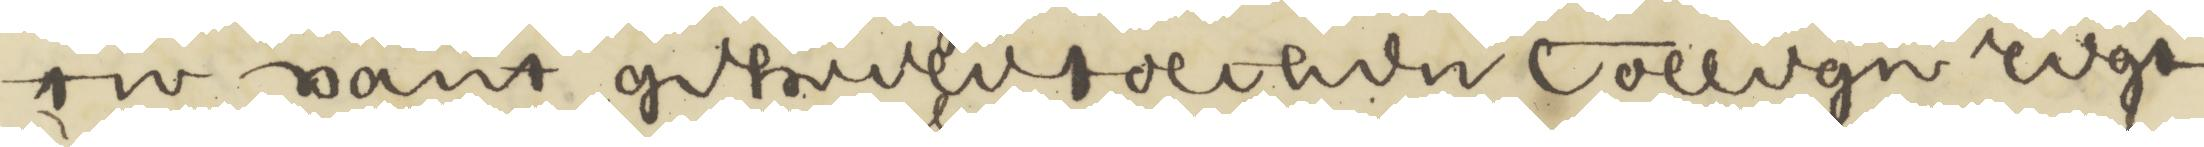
tie vant geheele tolcken Collegie regt
